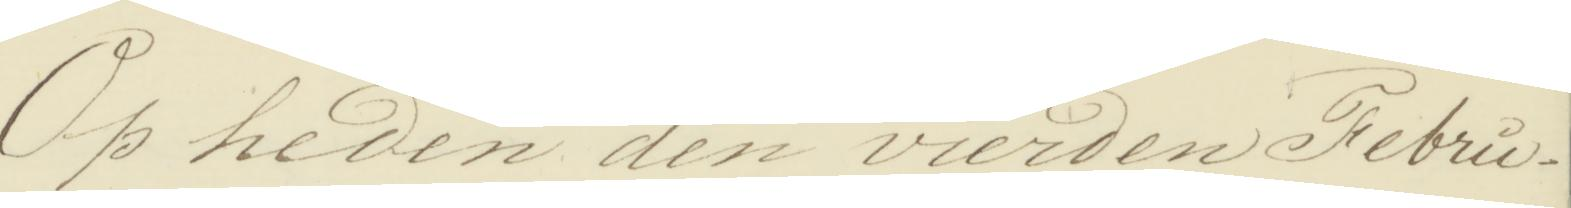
Op heden den vierden Febru-
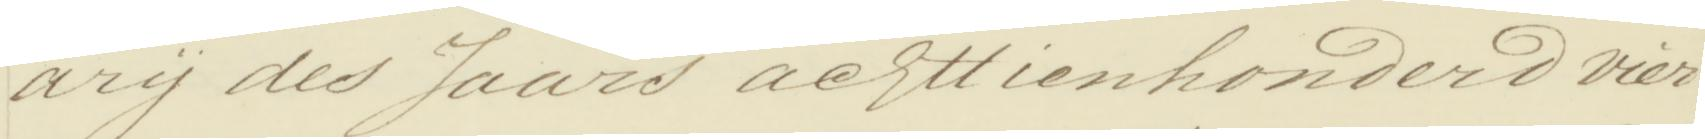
arij des Jaars achttienhonderd vier
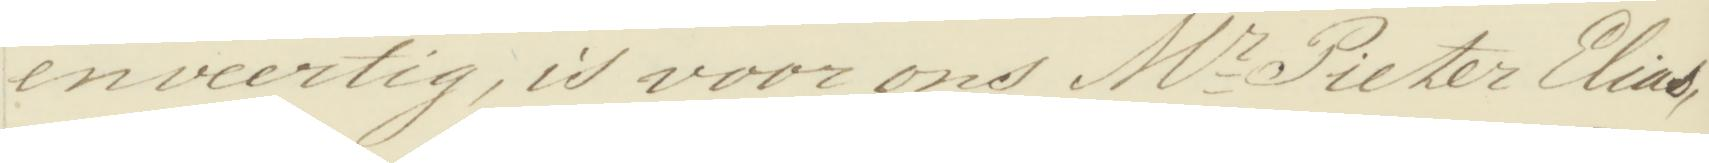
en veertig, is voor ons M=r Pieter Elias,
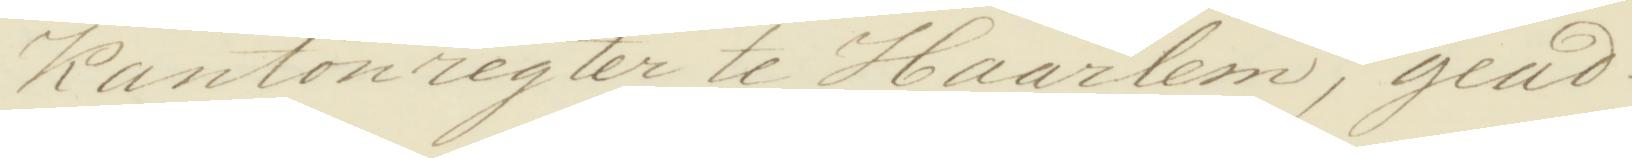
Kantonregter te Haarlem, gead-
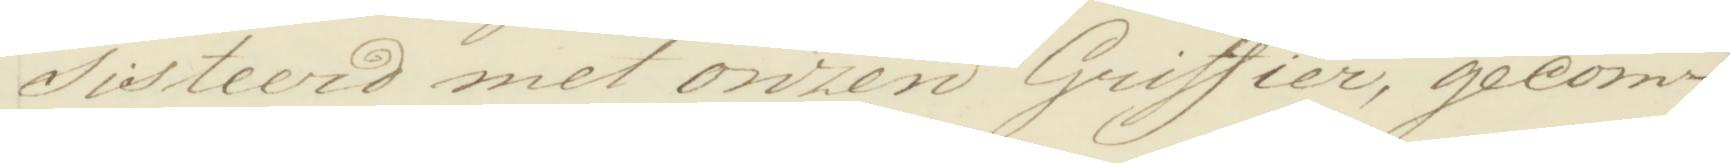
sisteerd met onzen Griffier, gecom-
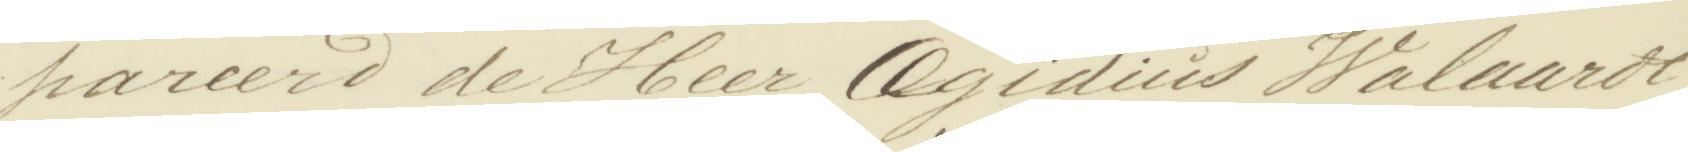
pareerd de Heer Aegidius Walaardt
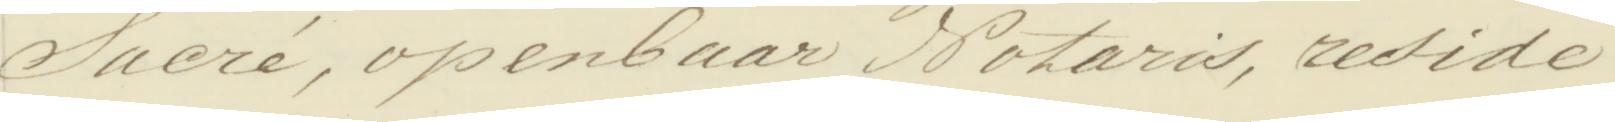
Sacré, openbaar Notaris, reside-
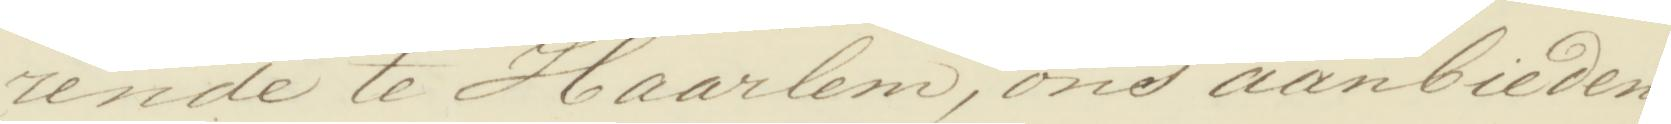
rende te Haarlem, ons aanbieden-
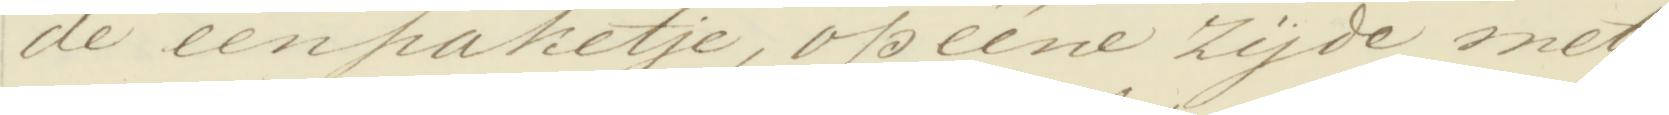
de een paketje, op ééne zijde met
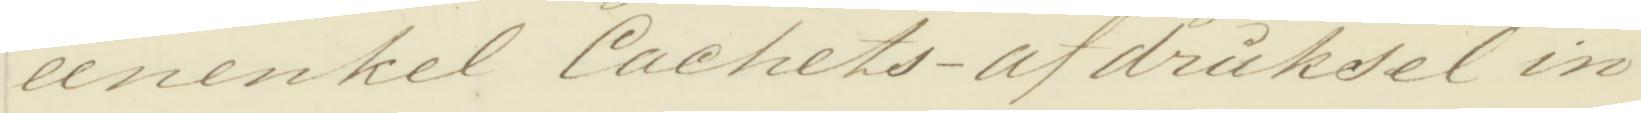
een enkel Cachets-afdruksel in
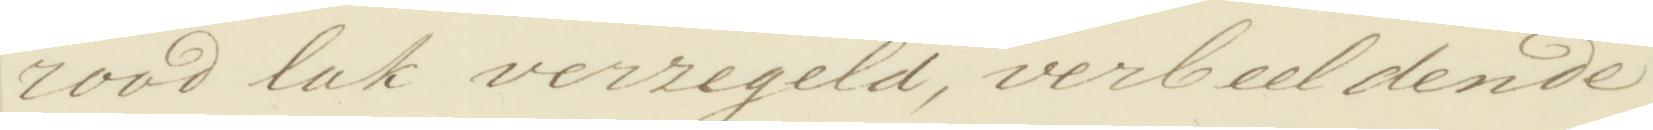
rood lak verzegeld, verbeeldende
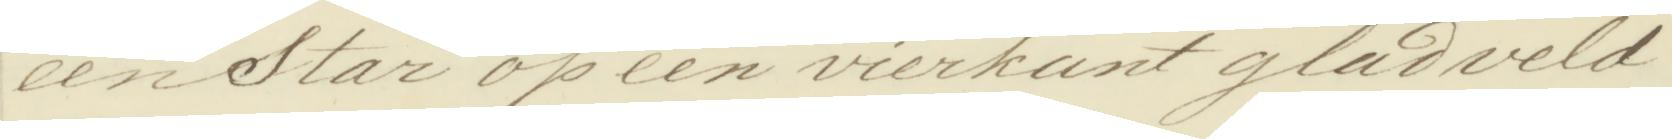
een star op een vierkant glad veld
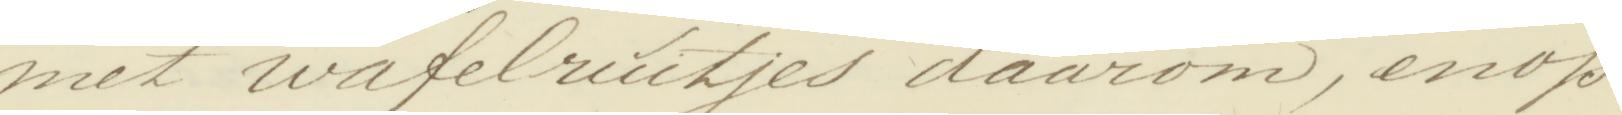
met wafelruitjes daarom, en op
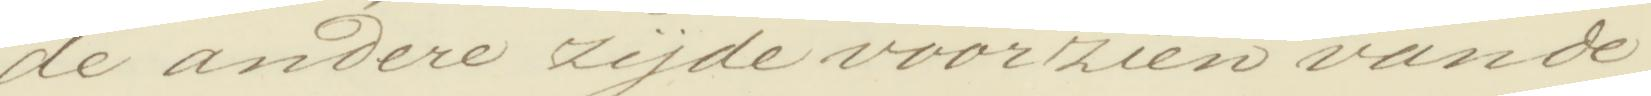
de andere zijde voorzien van de
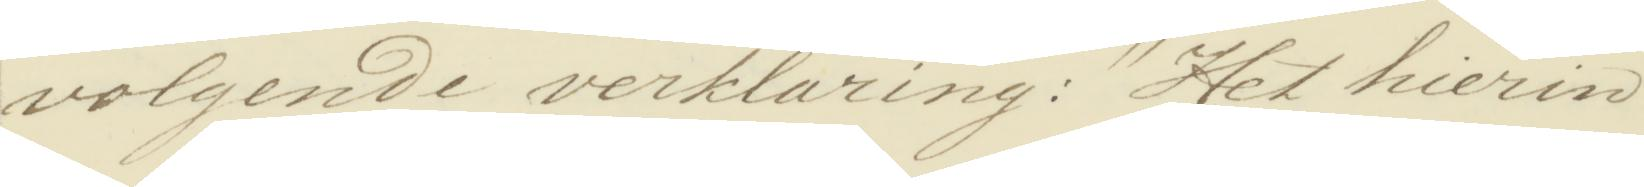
volgende verklaring: "Het hierin
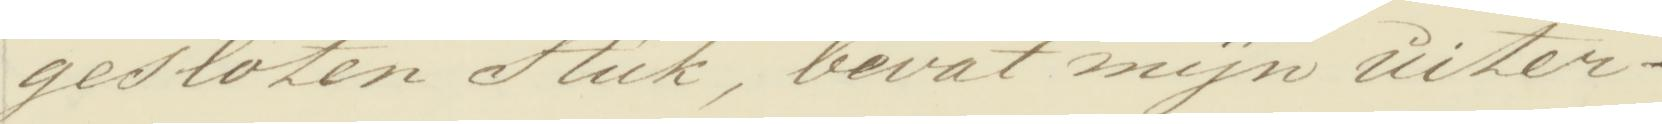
gesloten stuk, bevat mijn uiter-
